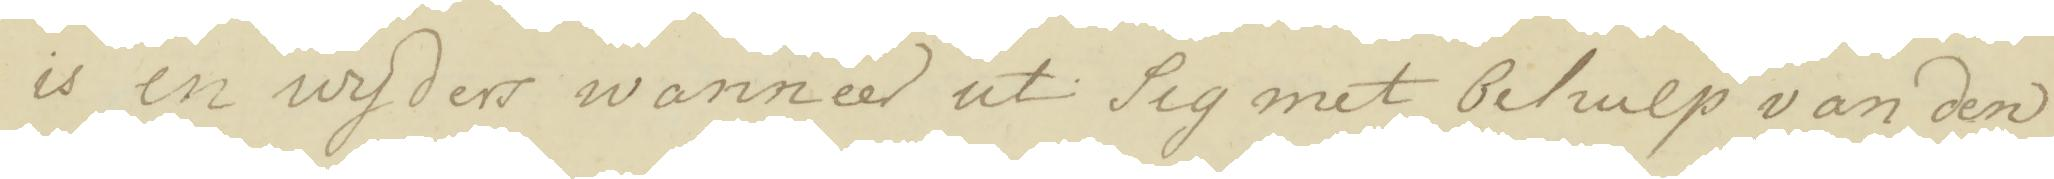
is en wyders wanneer ut sig met behulp van den
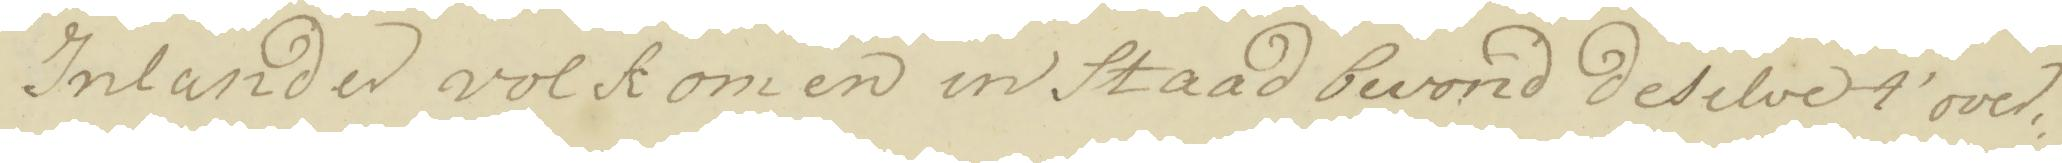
Inlander vol komen in staad bevond deselve t' over„
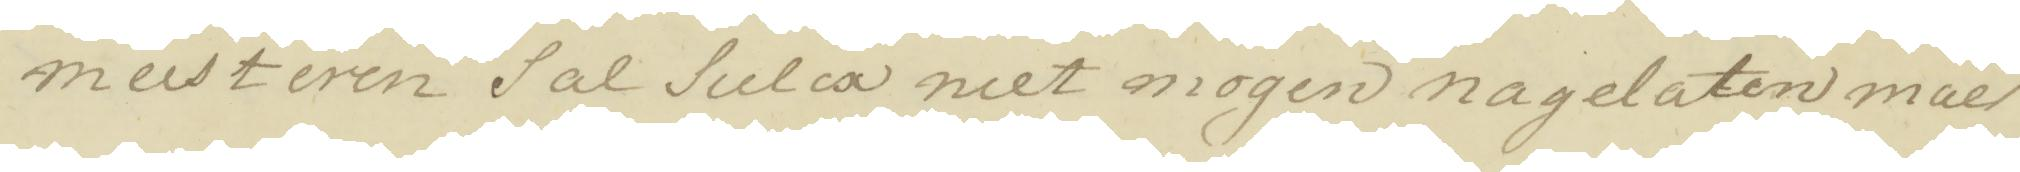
meesteren sal sulcx niet mogen nagelaten maer
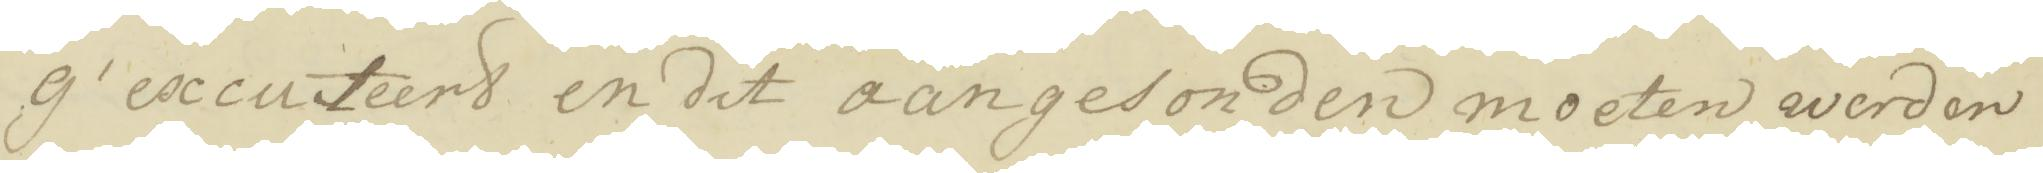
g’excuteert en dit aangesonden moeten werden
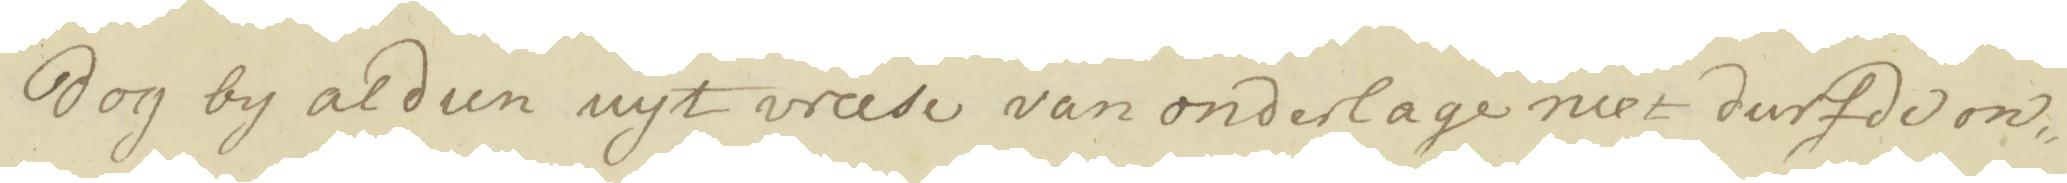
dog by aldien uyt vreese van onderlage niet durfde on„
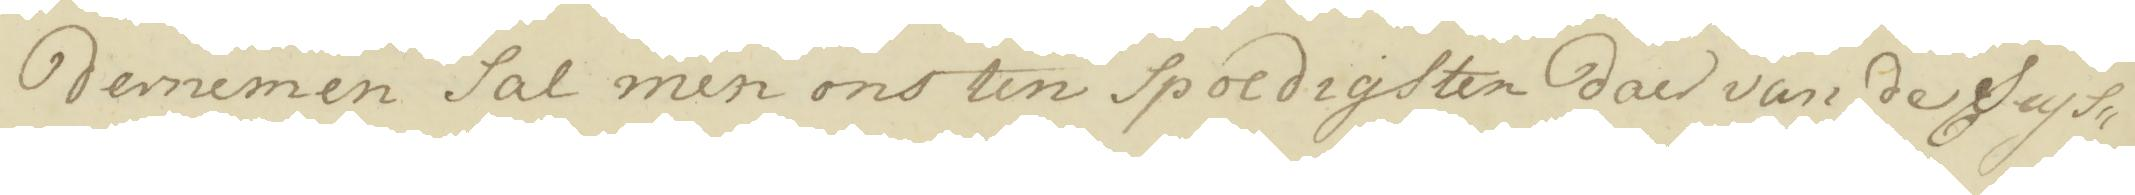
dernemen Sal men ons ten Spoedigsten daer van de vereys„
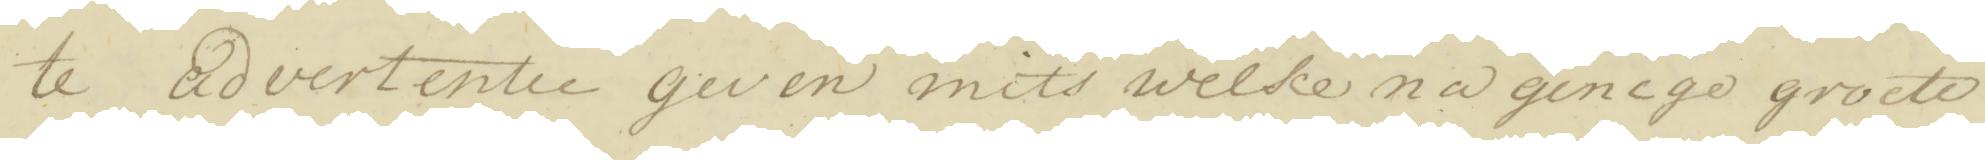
te advertentie geven mits welke na genege groete
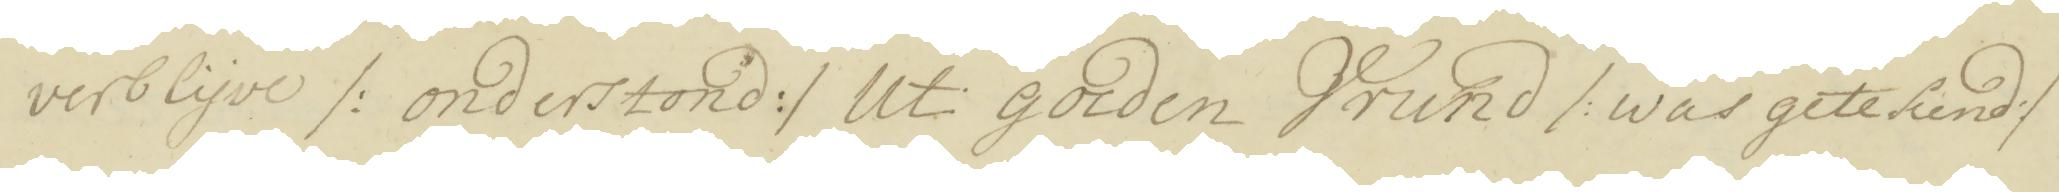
verblijve /:onderstond:/ UL goeden Vrund /:was getekend:/
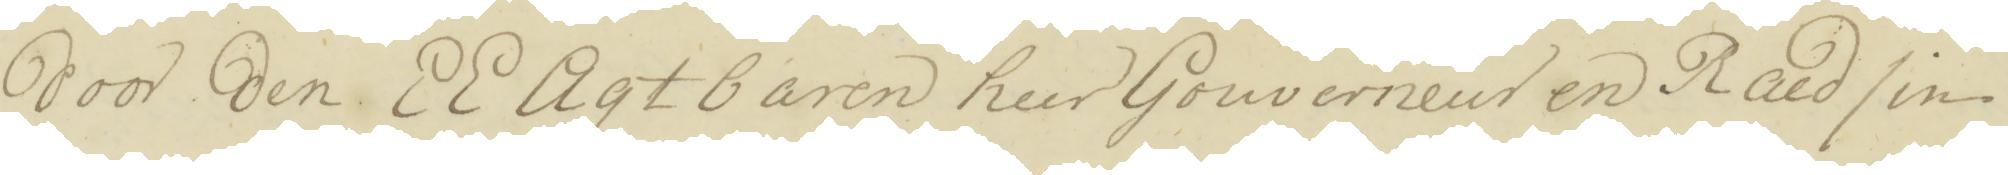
door den EE Agtbaren heer Gouverneur en Raed /in
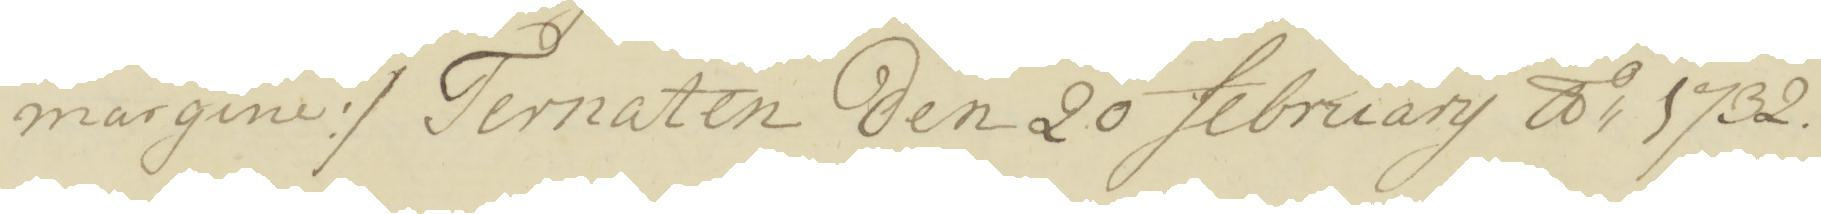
margine:/ Ternaten den 20 february A„o 1732.
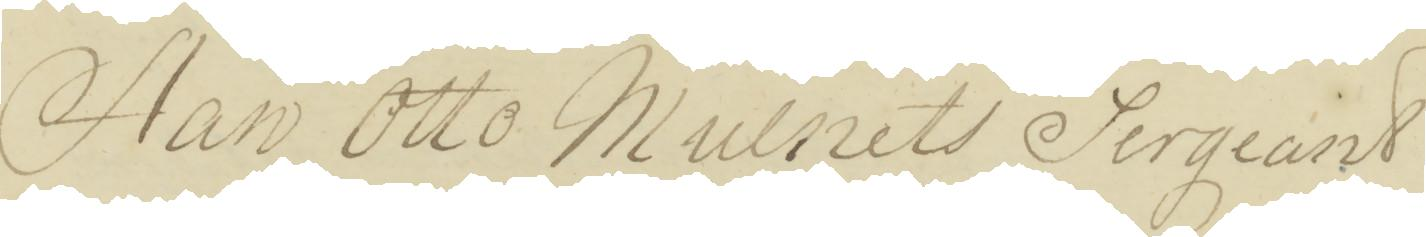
Aan Otto Mulnets Sergeant
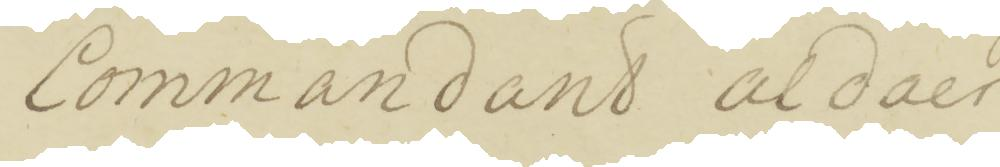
Commandant aldaer
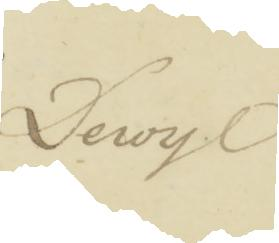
Dewyl
